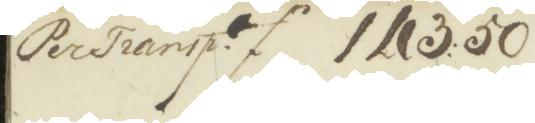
Per Transp:t ƒ 143: 50
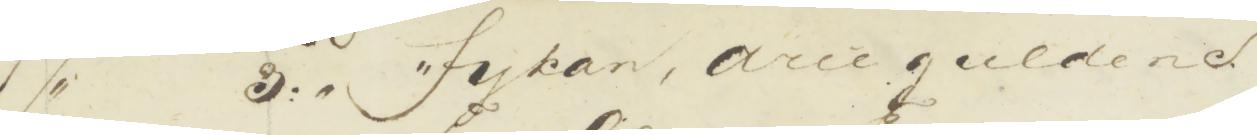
„ 3: „ „ fykan, drie guldens.
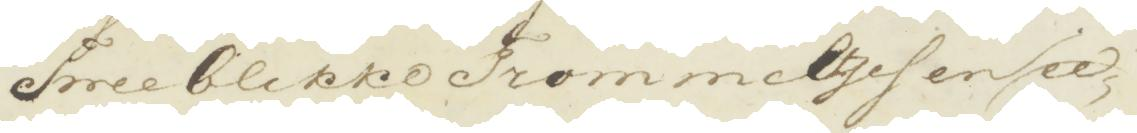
Twee blikke Trommeljes en ee„
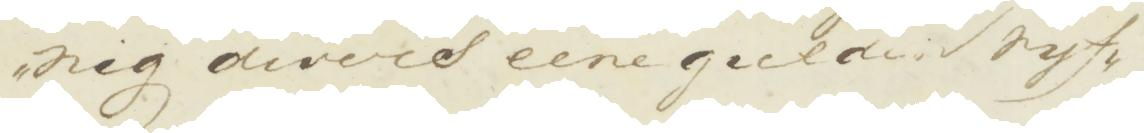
„nig divers eene gulden Vyf„
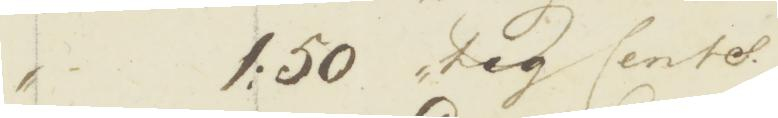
„1: 50 „tig Cents.
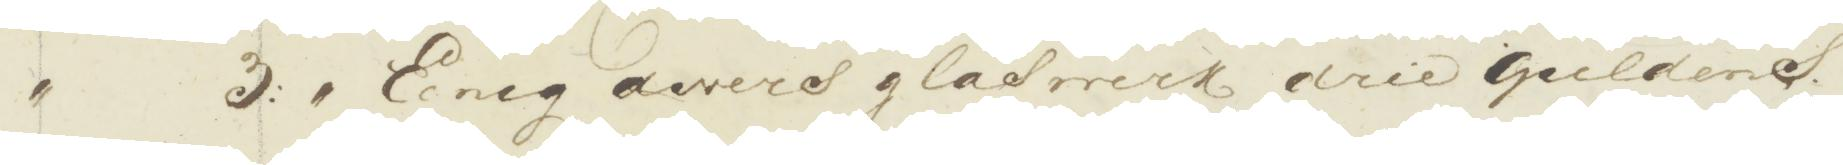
„ 3: „ Eenig divers glaswerk drie guldens.
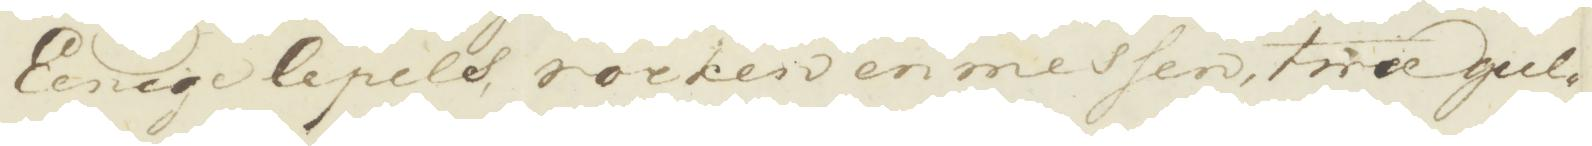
Eenige lepels, vorken en messen, twee gul„
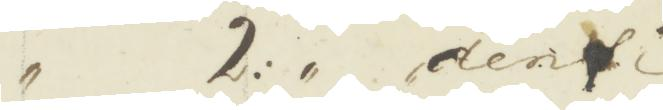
„ 2: „ „dens —
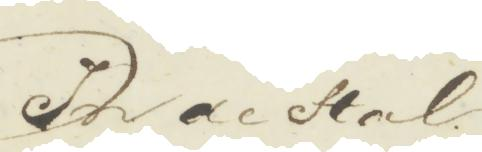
In de stal.
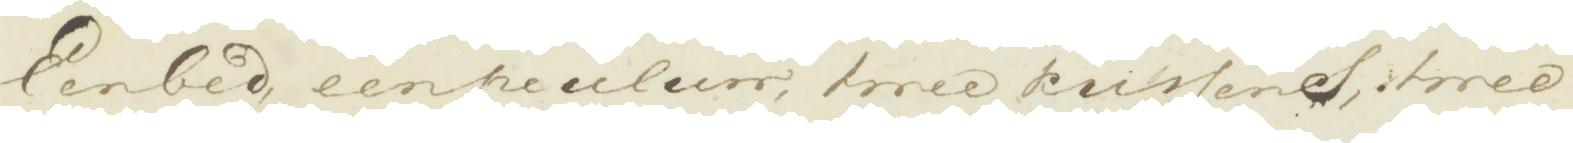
Een bed, een peuluw, twee kussens, twee
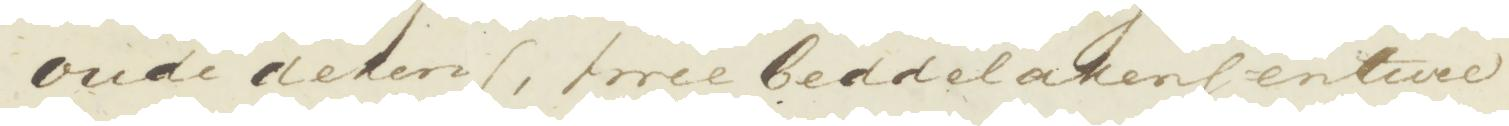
oude dekens, twee beddelakens en twee
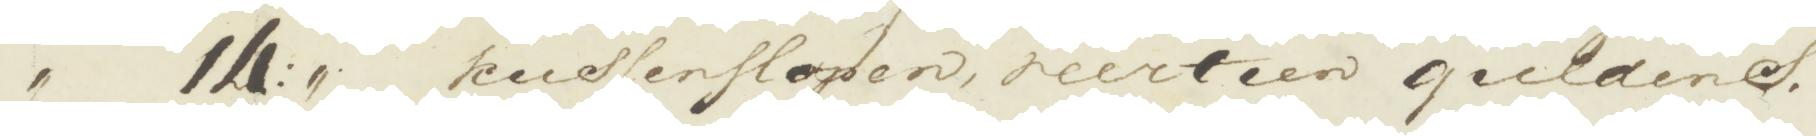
„ 14: „ kussenslopen, veertien guldens.
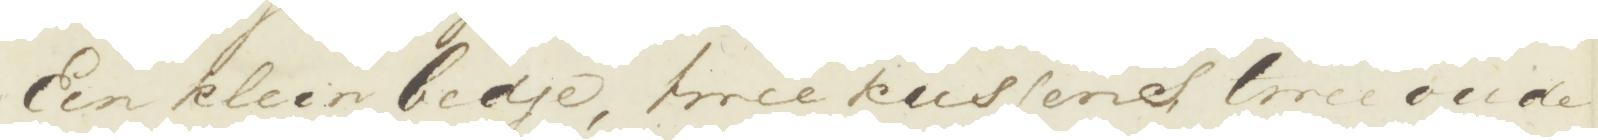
Een klein bedje, twee kussens, twee oude
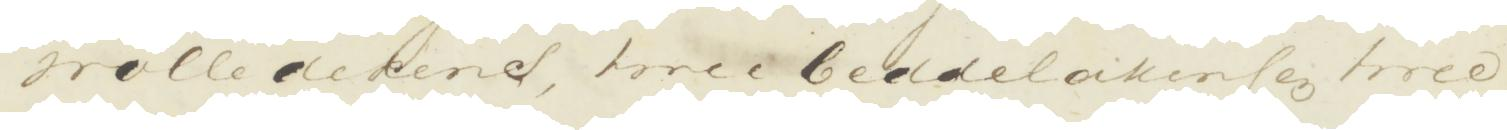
wolle dekens, twee beddelakens en twee
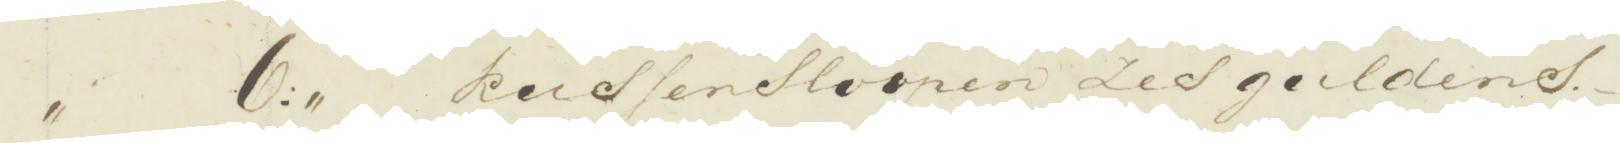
„ 6: „ kussensloopen zes guldens. —
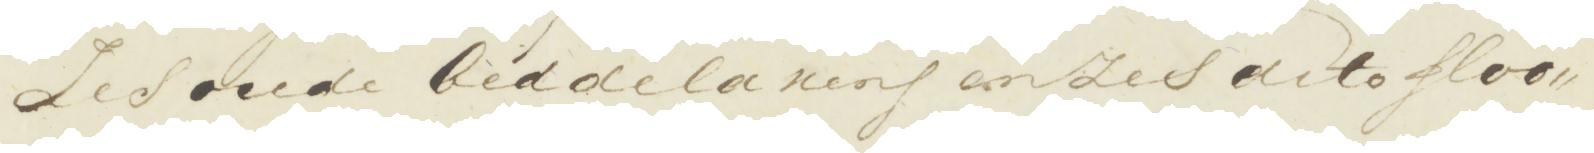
Zes oude beddelakens en zes dito sloo„
